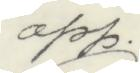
app.
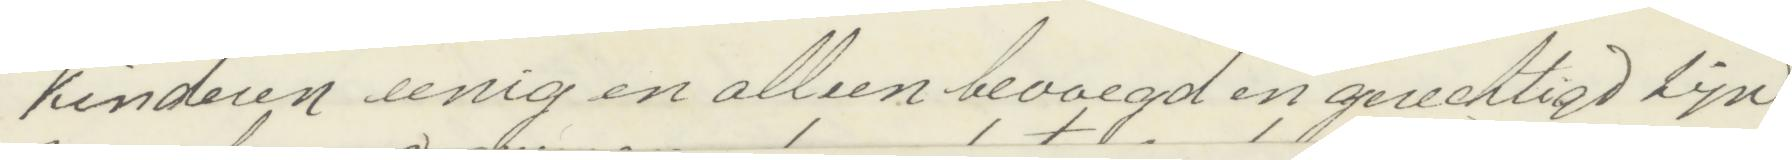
kinderen eenig en alleen bevoegd en gerechtigd zijn
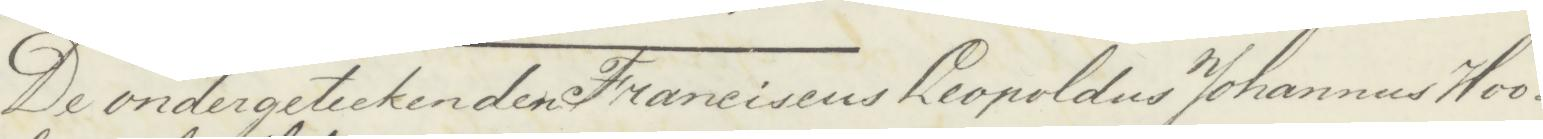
De ondergeteekenden Franciscus Leopoldus Johannus Hoo=
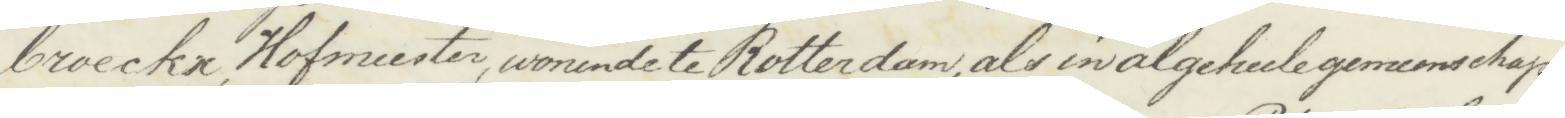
broeckx, Hofmeester, wonende te Rotterdam, als in algeheele gemeenschap
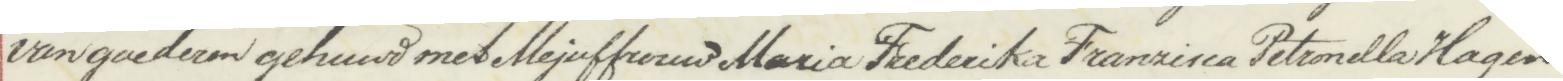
van goederen gehuwd met Mejuffrouw Maria Frederika Franzisca Petronella Hagen
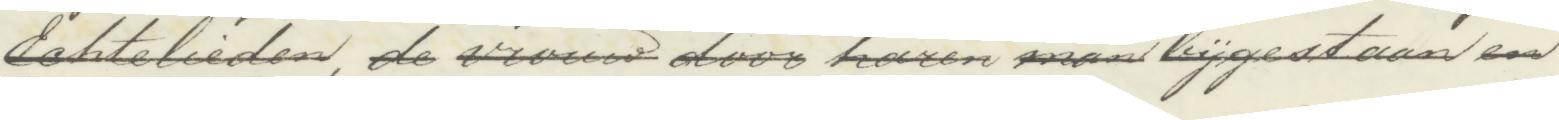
Echtelieden, de vrouw door haren man bijgestaan en
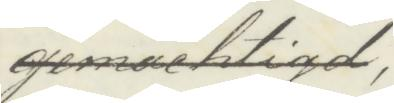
gemachtigd,
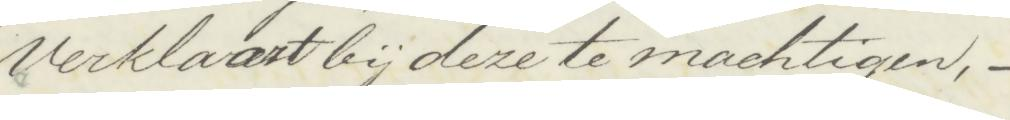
verklaart bij deze te machtigen,-
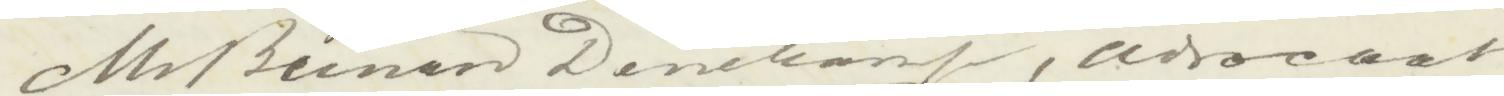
M Bernard Denekamp, advocaat
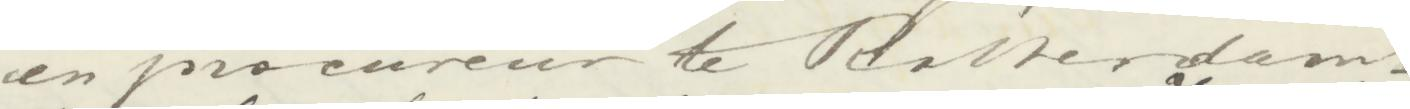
en procureur te Rotterdam
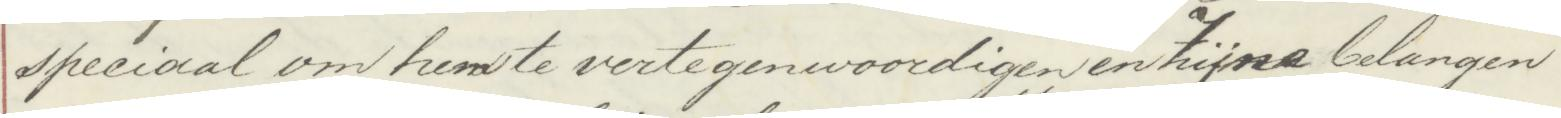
speciaal om hem te vertegenwoordigen en Zijne belangen
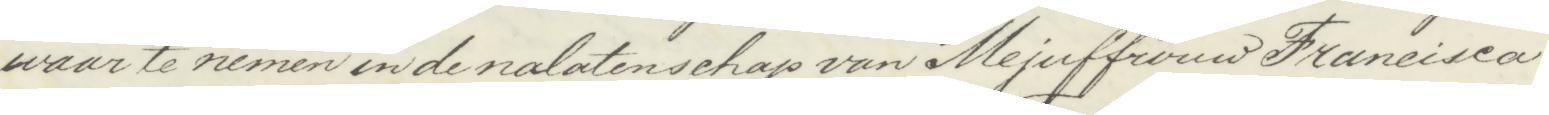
waar te nemen in de nalatenschap van Mejuffrouw Francisca
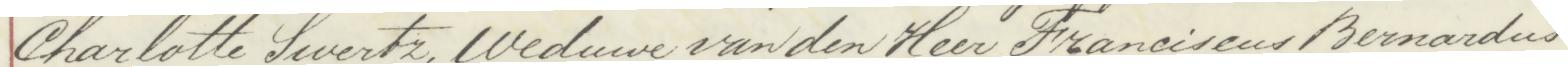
Charlotte Swertz, Weduwe van den Heer Franciscus Bernardus
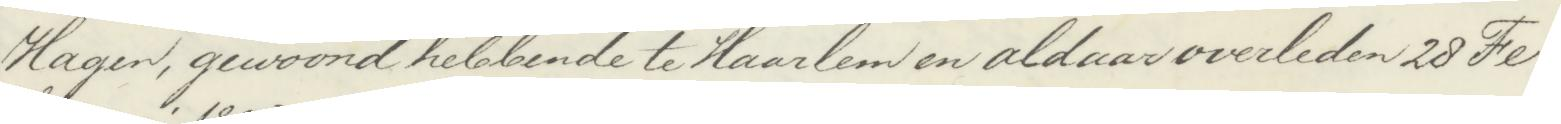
Hagen, gewoond hebbende te Haarlem en aldaar overleden 28 Fe=
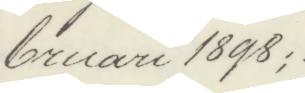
bruari 1898;
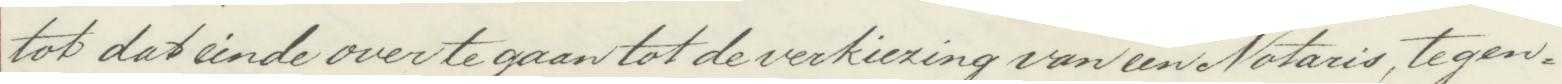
tot dat einde over te gaan tot de verkiezing van een Notaris, tegen„
